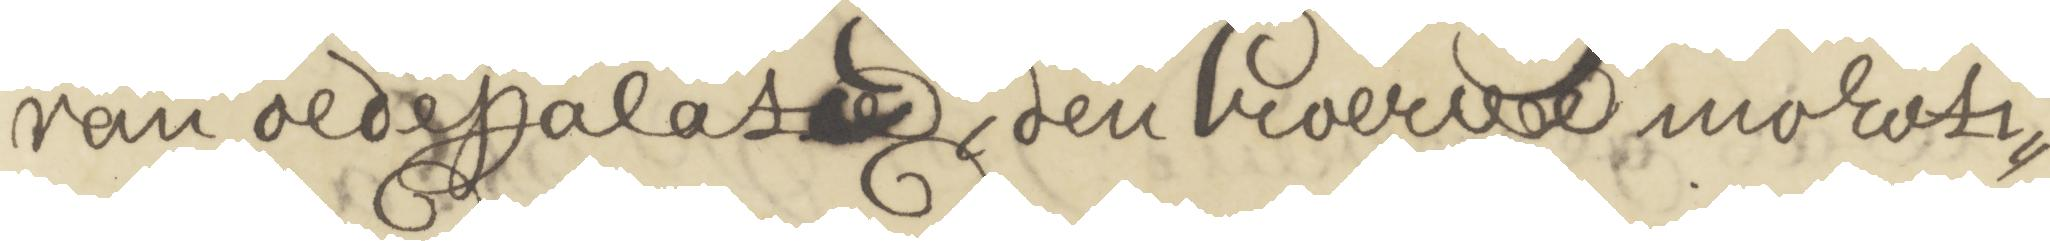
van oedepalate, den koerwe moheti„
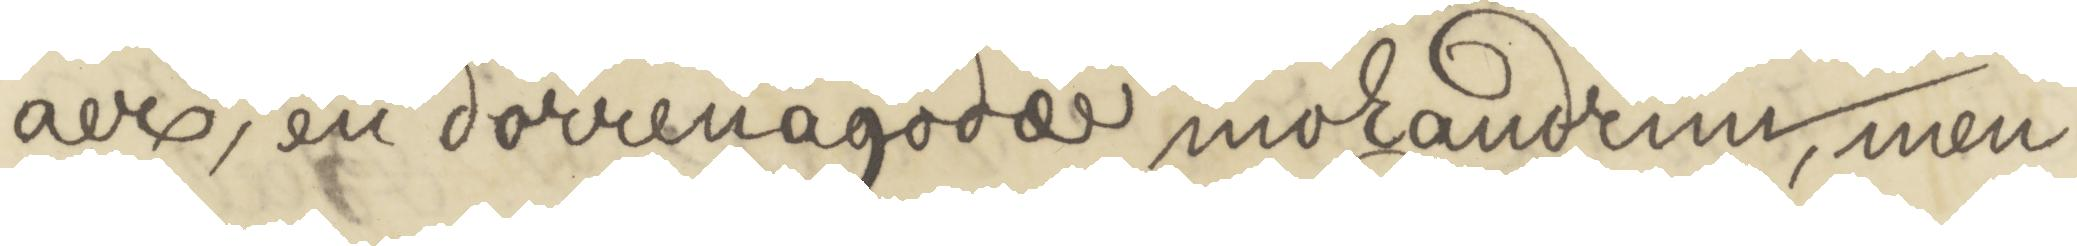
aer, en dorrenagodde mohandrim, men
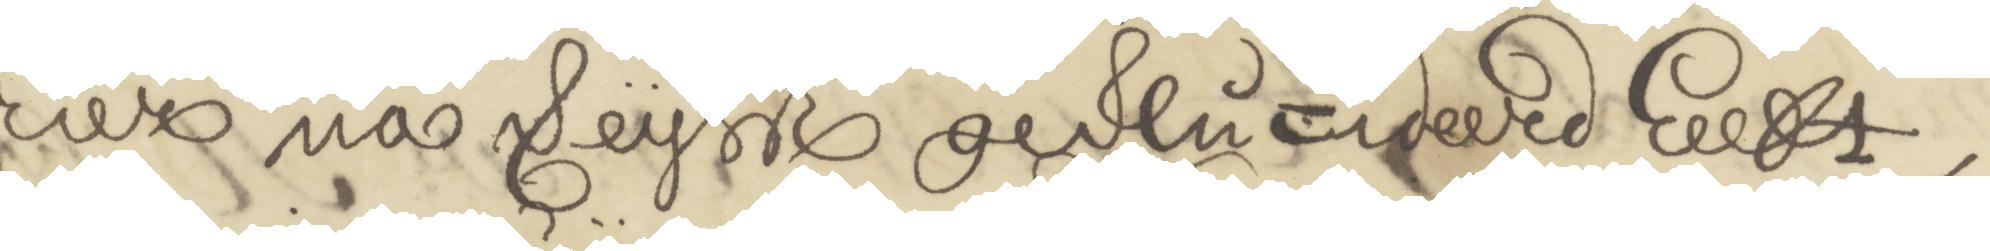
hier na vereijsch geverlucideerd heeft,
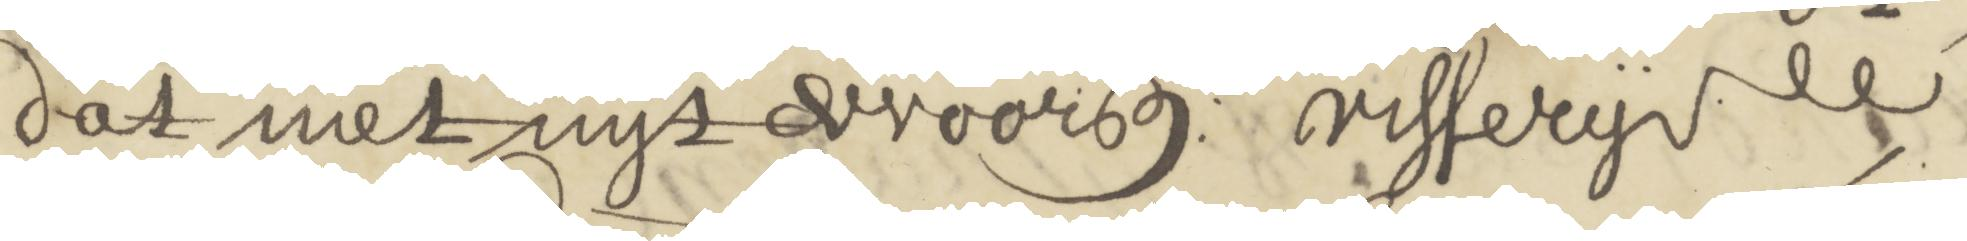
dat niet uijt de voors: visserije,
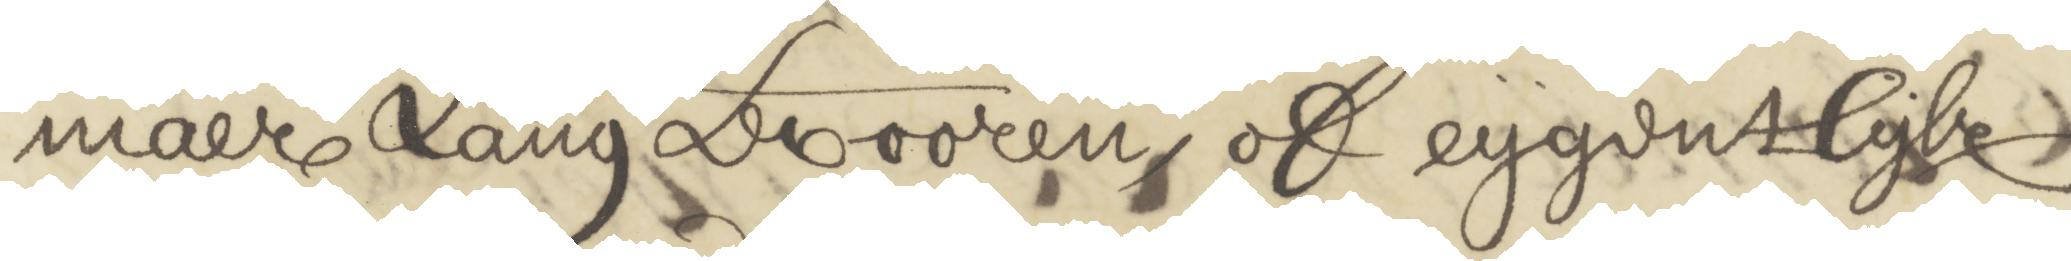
maer lang tevooren, of eijgentlijk
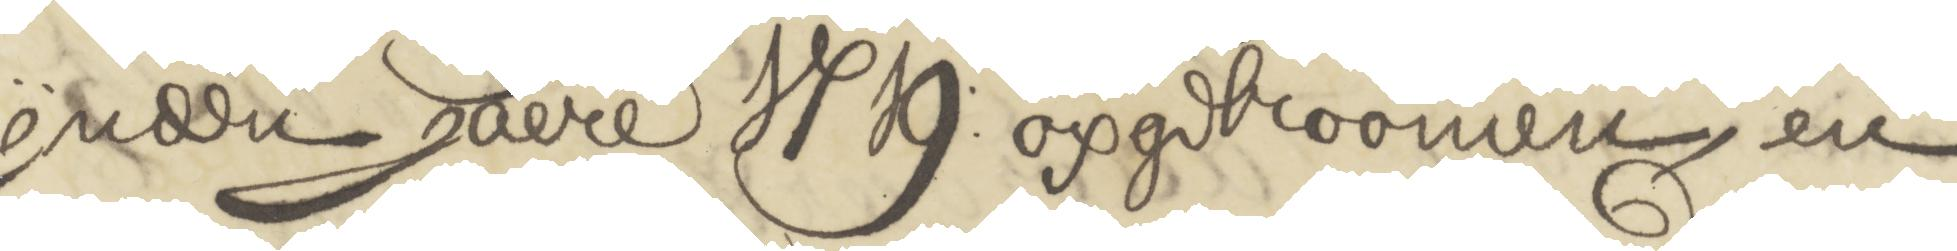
jnden jaere 1719: opgekoomen, en
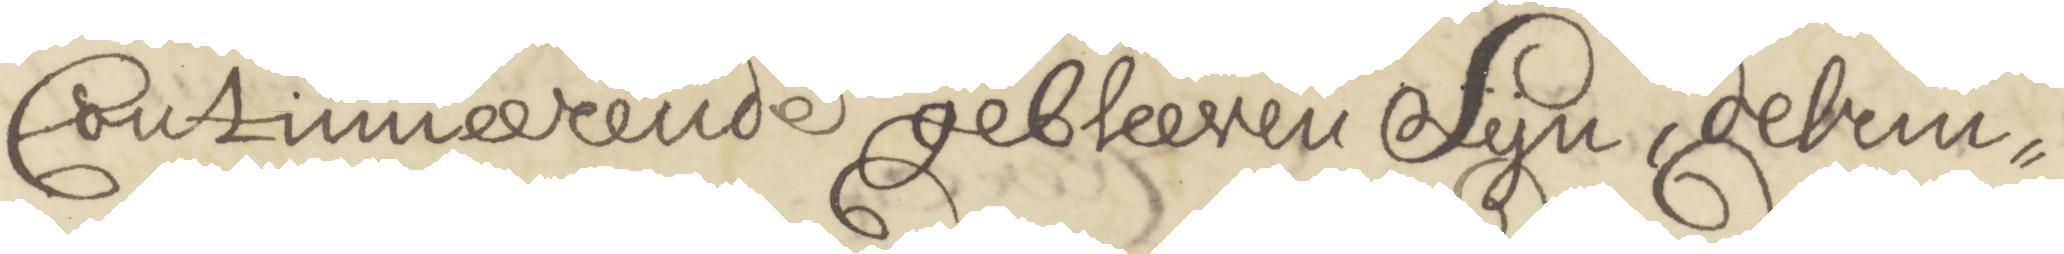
Continueerende gebleeven sijn, de kin„
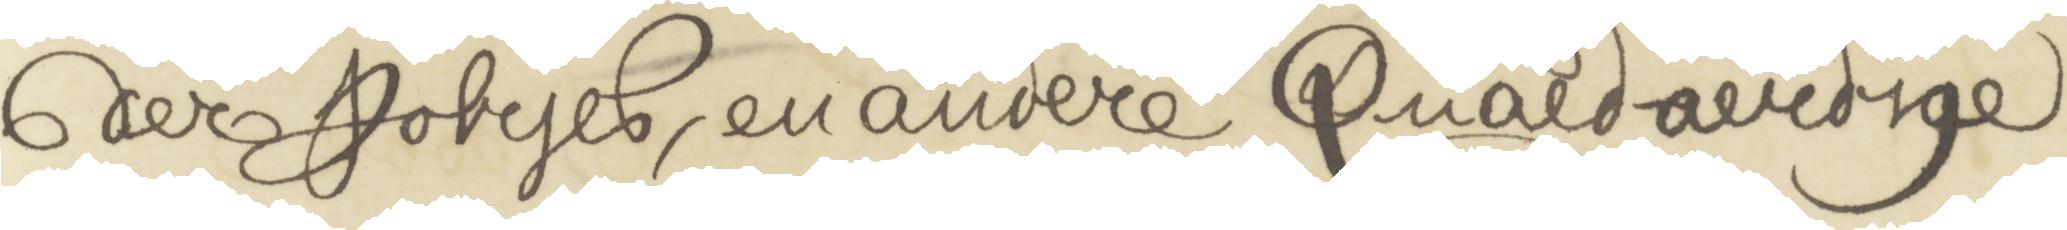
der pokjes, en andere Quaedaerdige
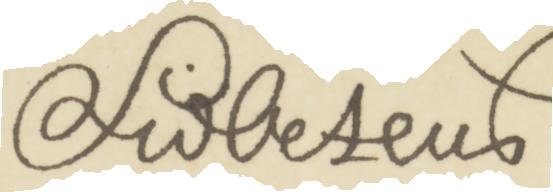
Siektens
